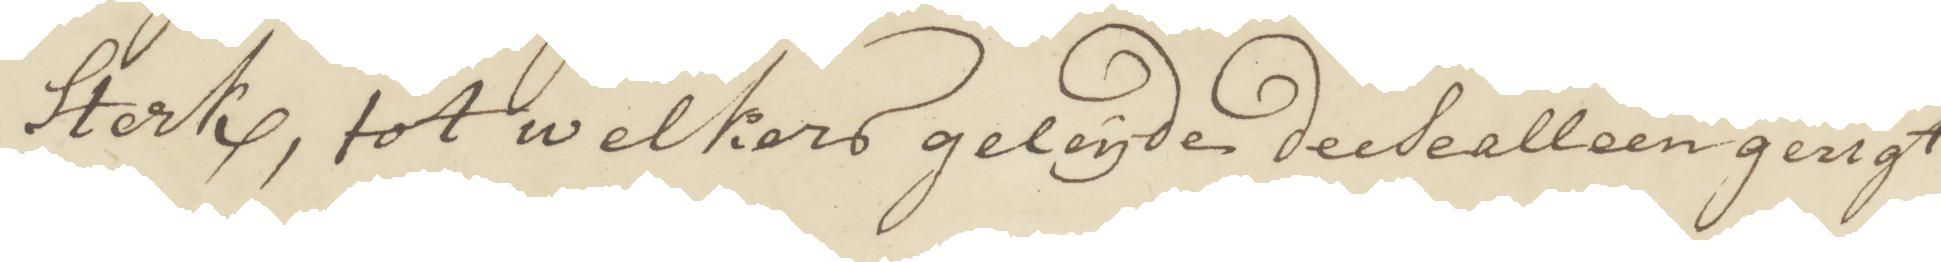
sterk, tot welkers geleijde deese alleen gerigt
